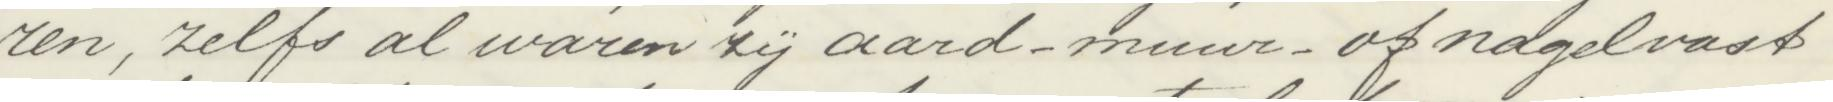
ren, zelfs al waren zij aard- muur- of nagelvast
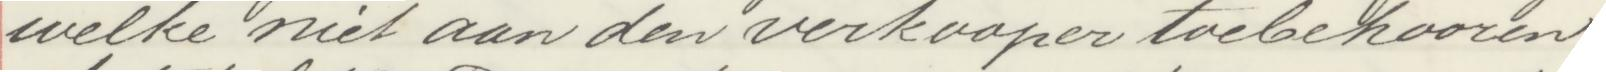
welke niet aan den verkooper toebehooren.
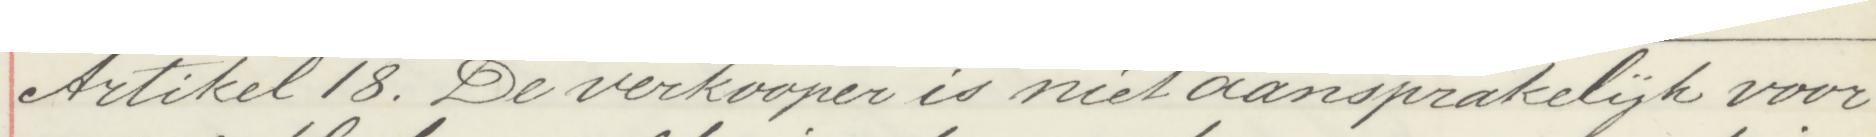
Artikel 13. De verkooper is niet aansprakelijk voor
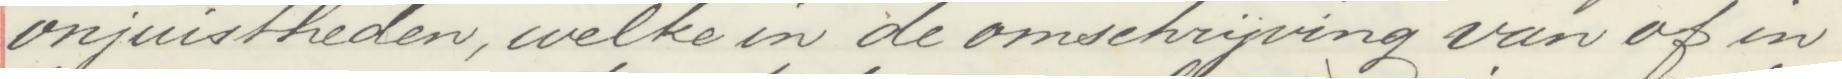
onjuistheden, welke in de omschrijving van of in
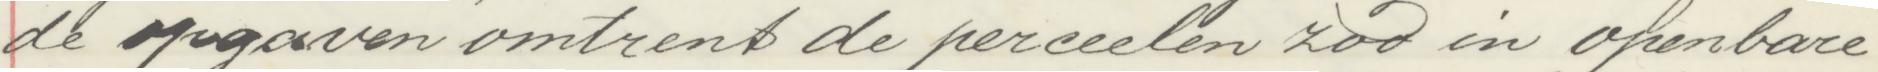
de opgaven omtrent de perceelen zoo in openbare
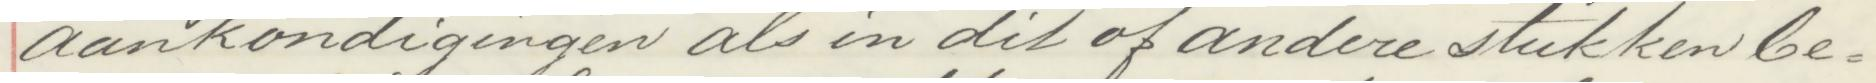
aankondigingen als in dit of andere stukken be„
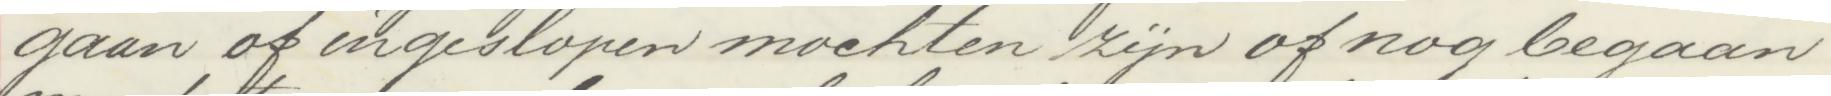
gaan of ingeslopen mochten zijn of nog begaan
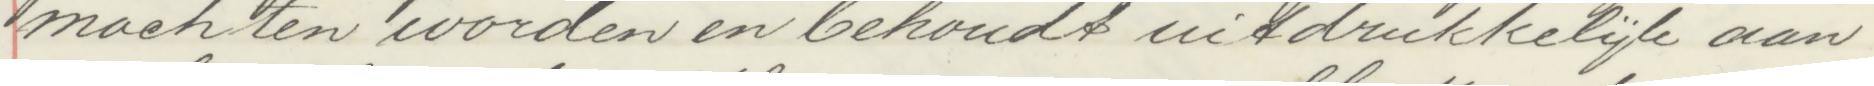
mochten worden en behoudt uitdrukkelijk aan
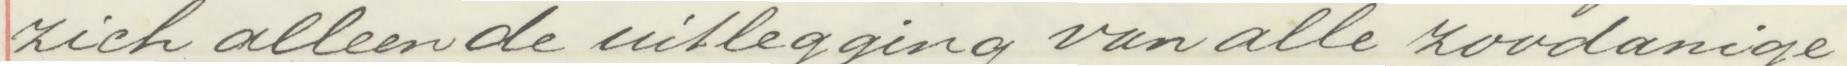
zich alleen de uitlegging van alle zoodanige
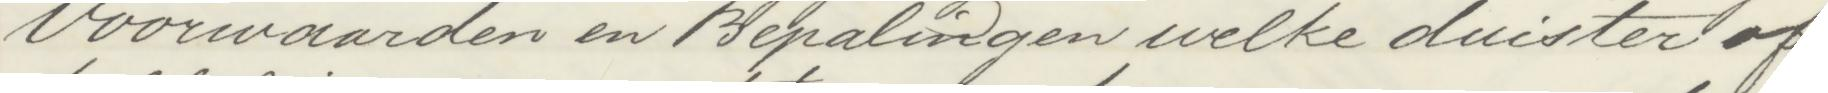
Voorwaarden en Bepalingen welke duister of
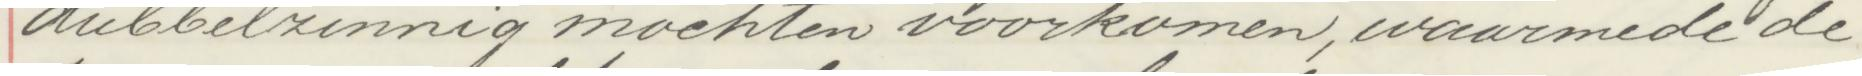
dubbelzinnig mochten voorkomen, waarmede de
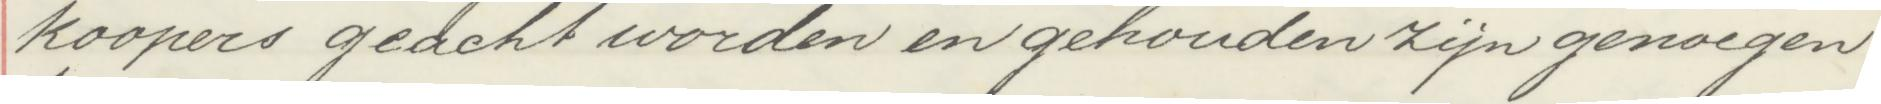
koopers geacht worden en gehouden zijn genoegen
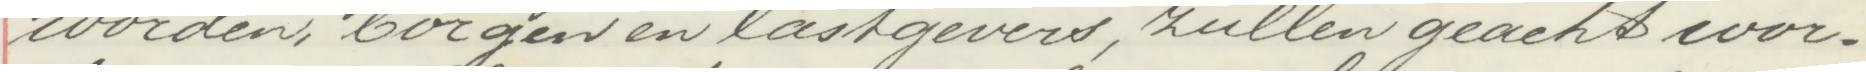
worden, borgen en lastgevers, zullen geacht wor„
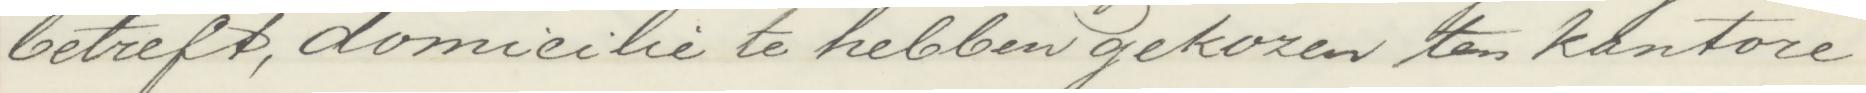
betreft, domicilie te hebben gekozen ten kantore
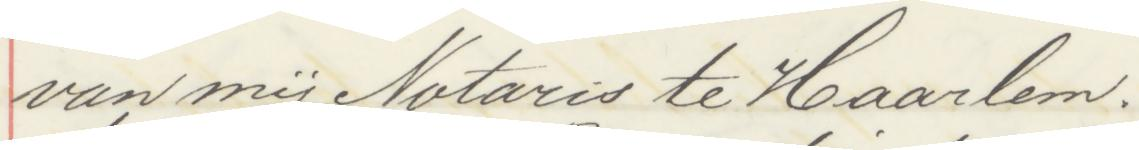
van mij Notaris te Haarlem.
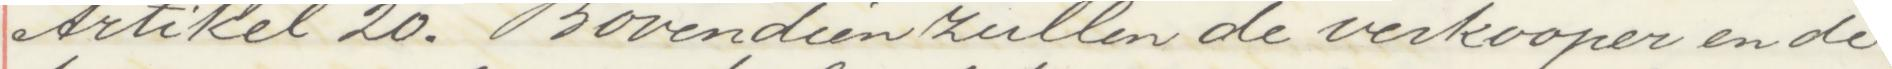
Artikel 20. Bovendien zullen de verkooper en de
